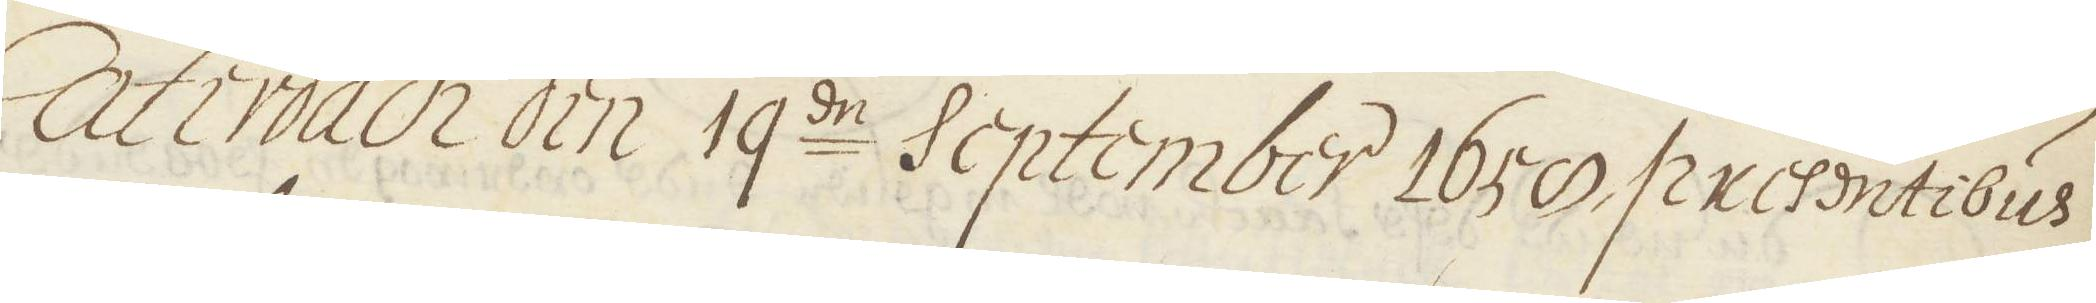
Saterdach den 19=en September 1658, presentibus
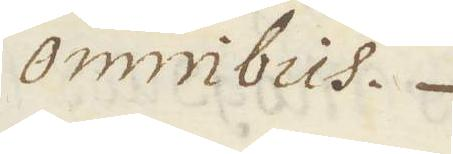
omnibus.-
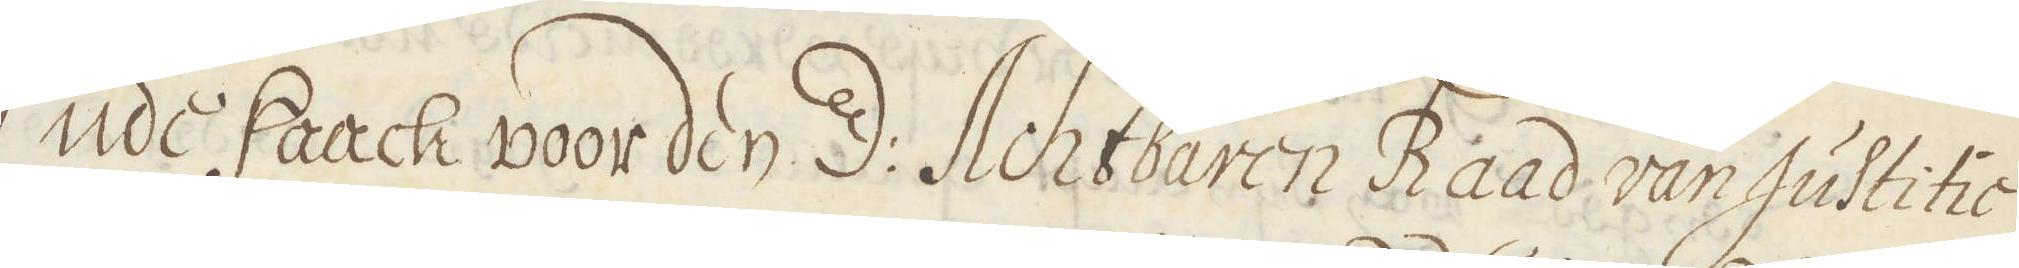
Jnde saack voor den E: Achtbaren Raad van Justitie
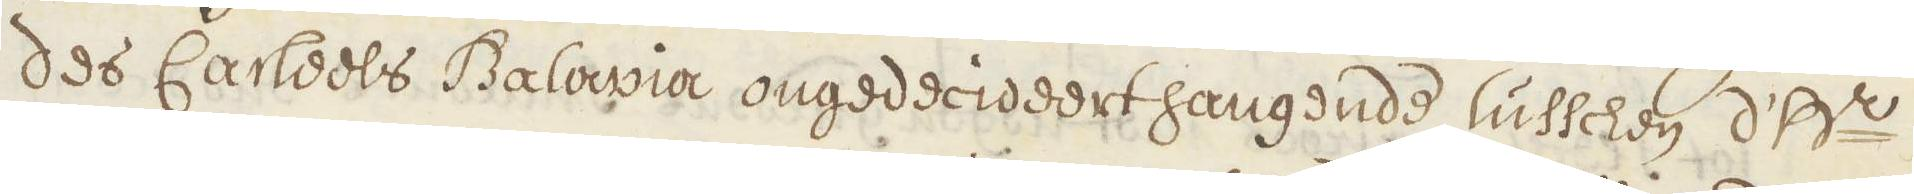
des Casteel Batavia ongedecideert hangende tusschen d’ H=r
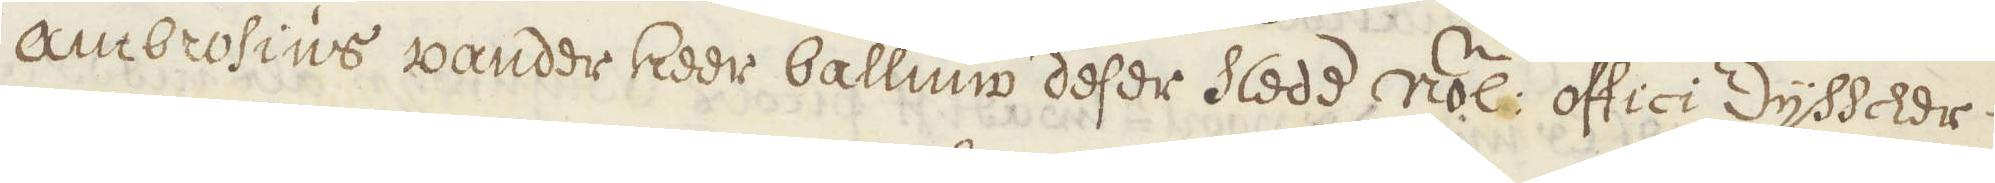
ambrosius vander keer balliuw deser stede Nol: offici Eijsscher
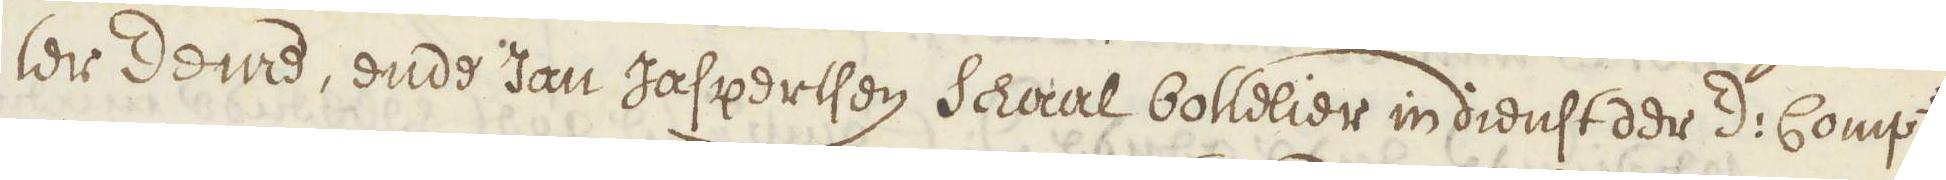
ter Eenre, ende Ian Jaspertsen schaal bottelier in dienst der E: Comps
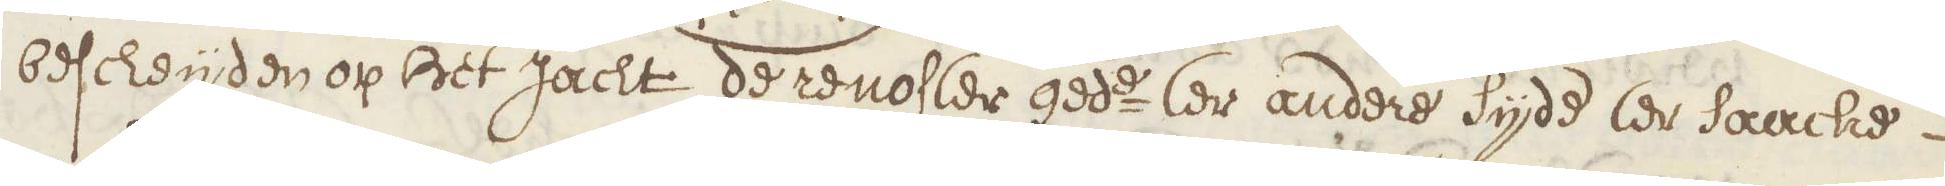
bescheijden op het Jacht de renoster ged=e ter andere sijde ter saacke -
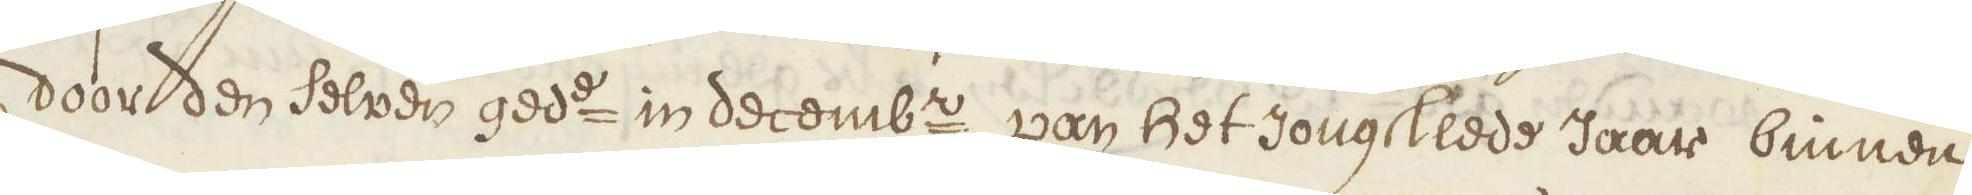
door den selven ged=e in decemb=r van het Iongstlede Iaar binnen
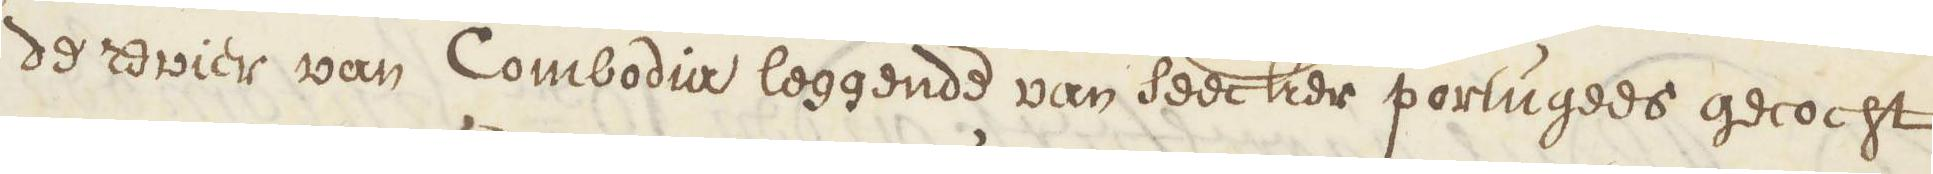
de revier van Combodia leggende van seecker portugees gecocht
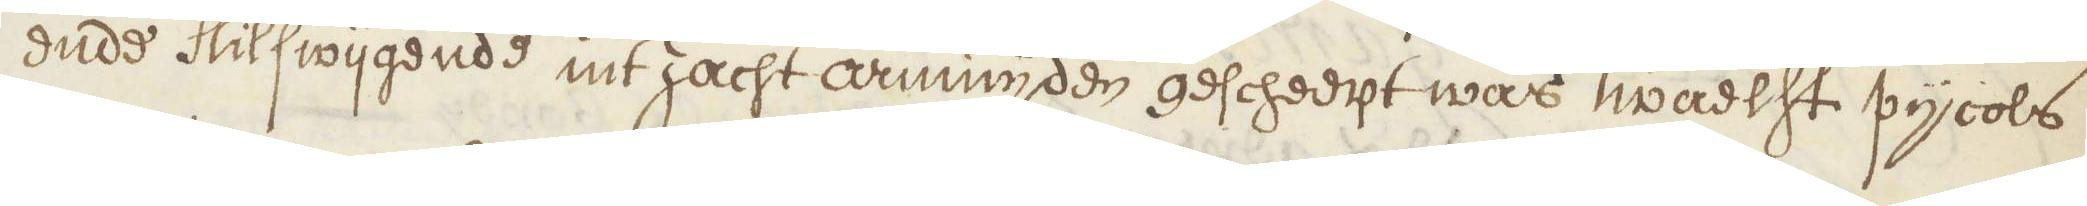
ende stilswijgende int jacht armuijden gescheept war twaelft pijcols
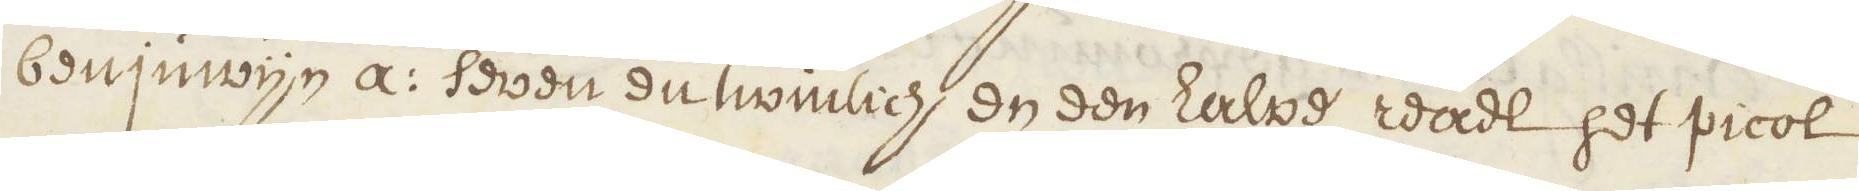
benjuwijn a: seven en twintich en een halve reael het picol
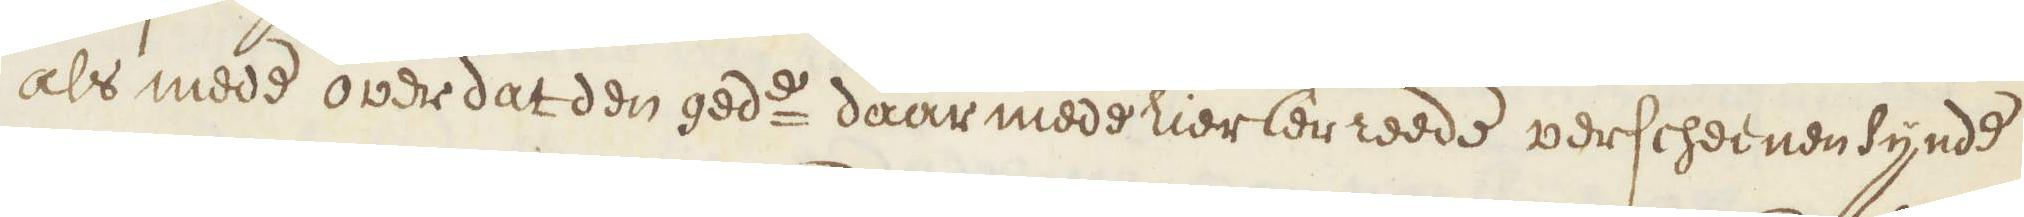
als mede over dat den ged=e daar mede hier ter reede verscheenen sijnde
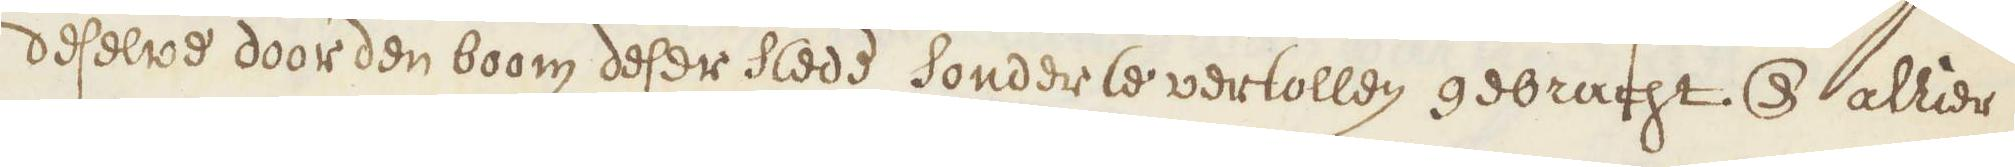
deselve door den boom deser stede sonder te vertollen gebracht. ende alhier
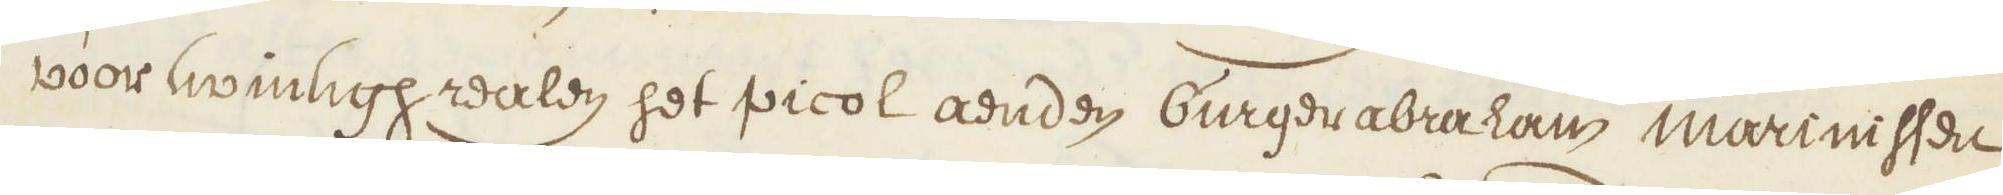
voor twintigh realen het picol aenden burger abraham marinissen
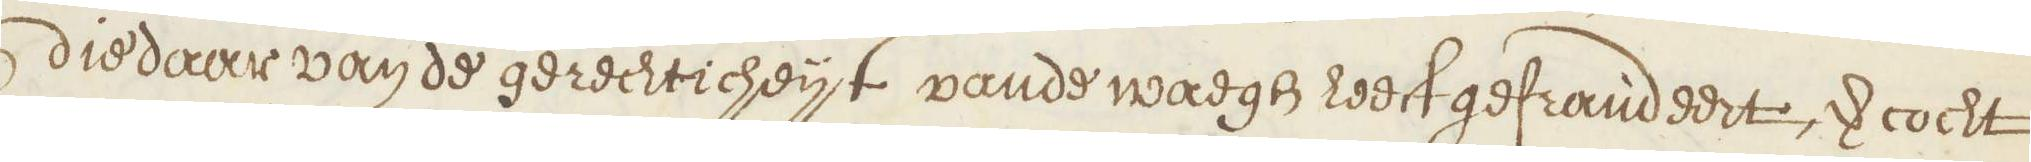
die daar van de gerechticheijt vande waegh heeft gefraudeert, vercocht
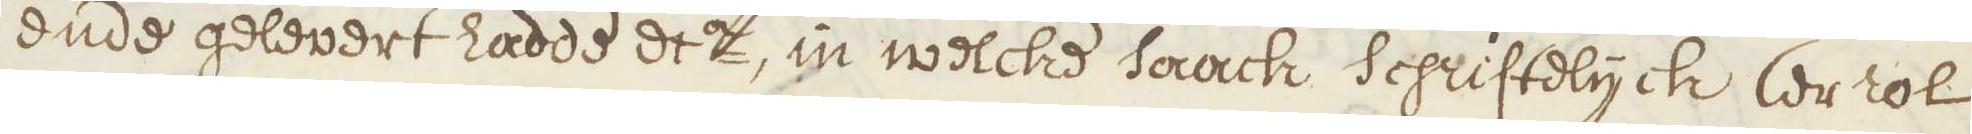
ende gelevert hadde et=a, in welcke saack schriftelijck ter rol
